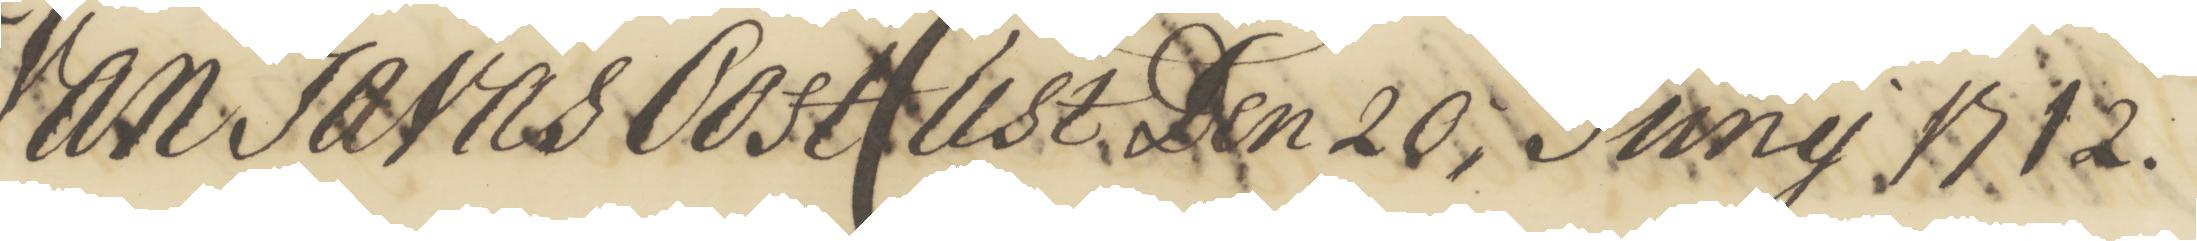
Van Java's Oost Cust Den 20„' Junij 1712.
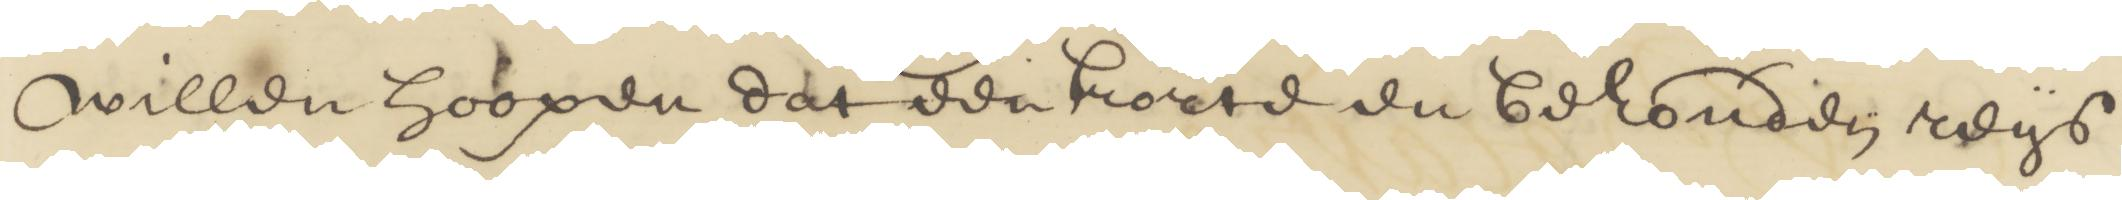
willen hoopen dat een korte en behouden reijs
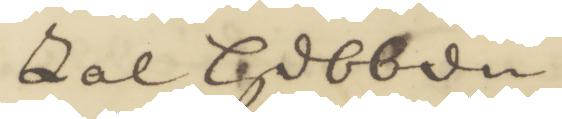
zal hebben
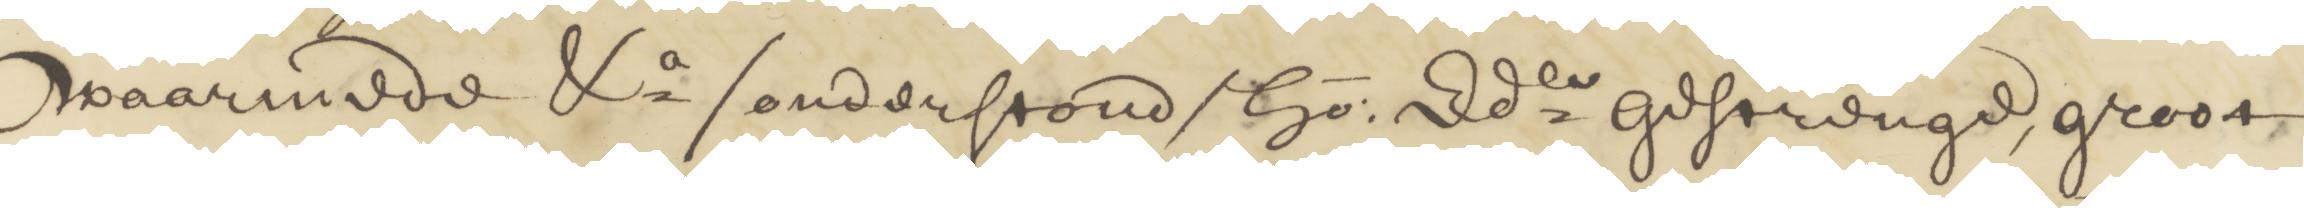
waarmede &=a /onderstond/ ho: Ed=le gestrenge, groot
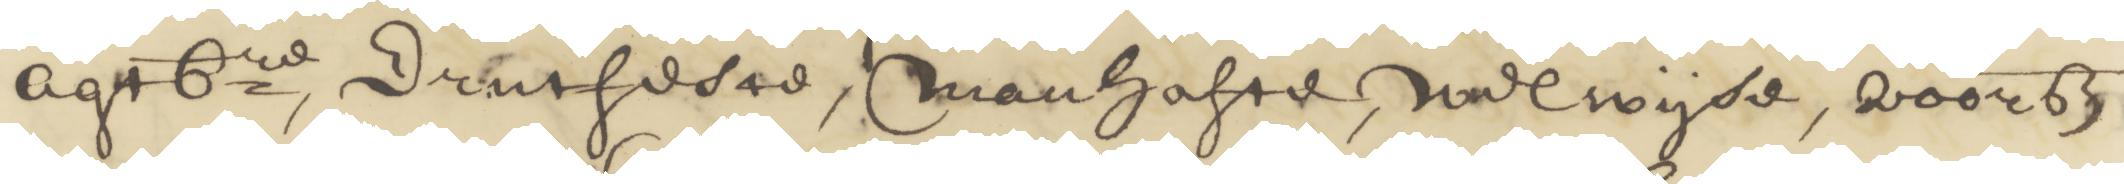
agtb=re, Erntfeste, manhafte, wel wijse, voorsz
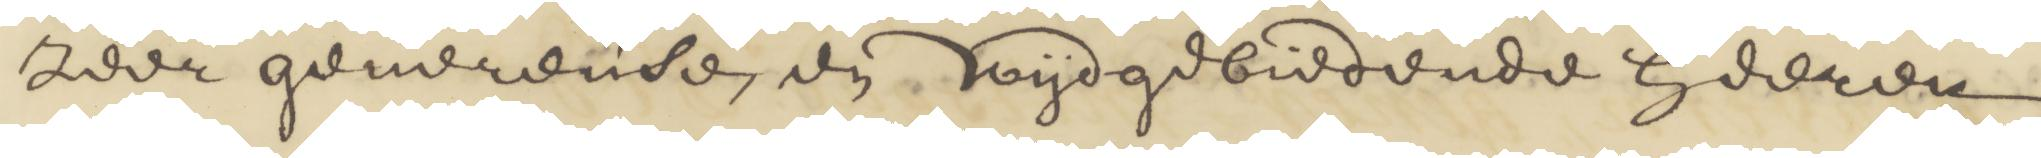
zeer genereuse, en wijdgebiedende heeren
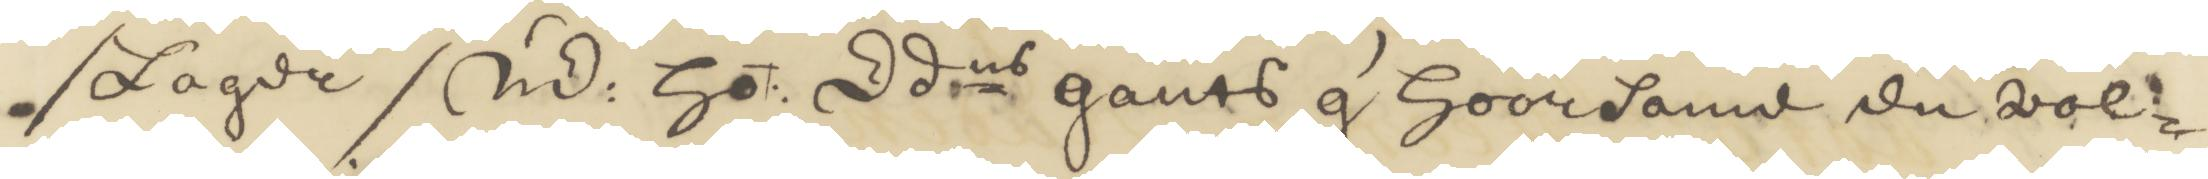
/lager/ uE: ho: Ed=ns gants g’hoorsame en vol=
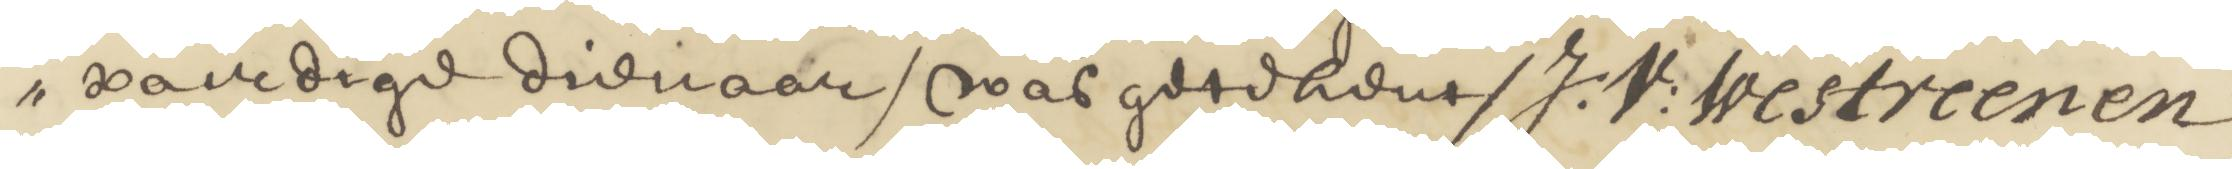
„vairdige dienaar /was getekent/ J: V: Westreenen
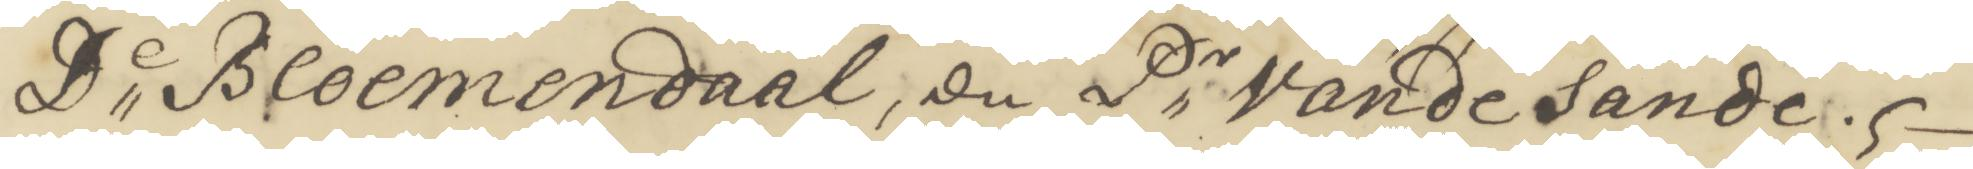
D„e Bloemendaal, en P„r van de sande.
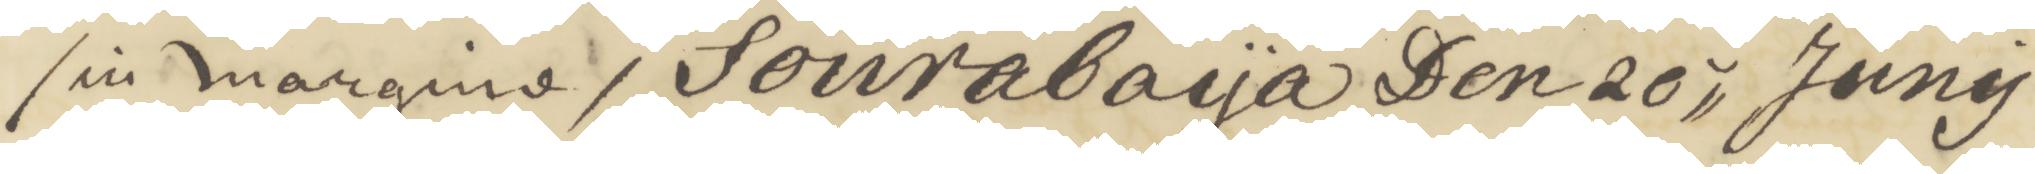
/in margine/ sourabaija Den 20„' Junij
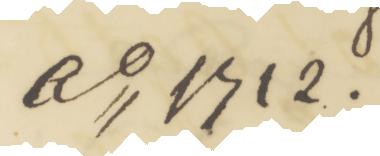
a„o 1712.
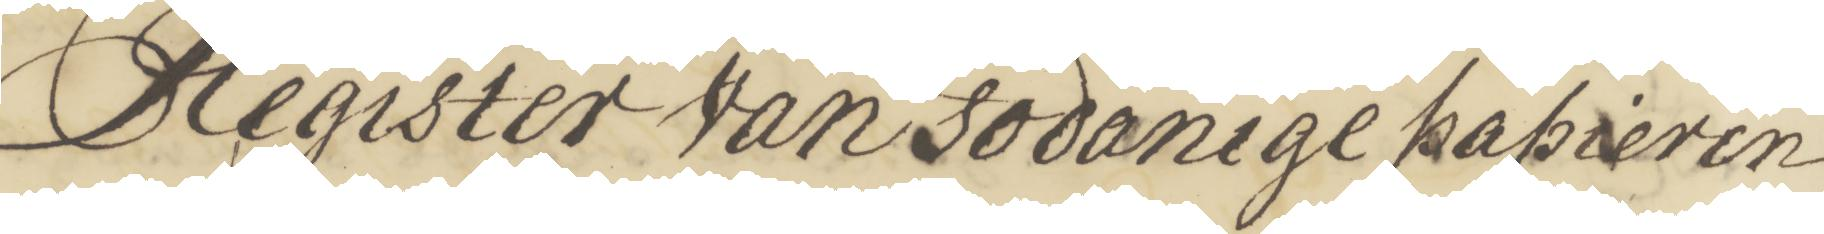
Register van sodanige papieren
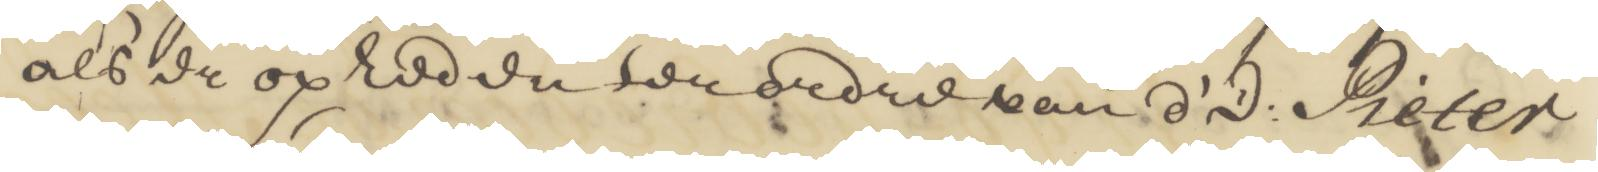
als' er op heden ter ordre van d’E: Pieter
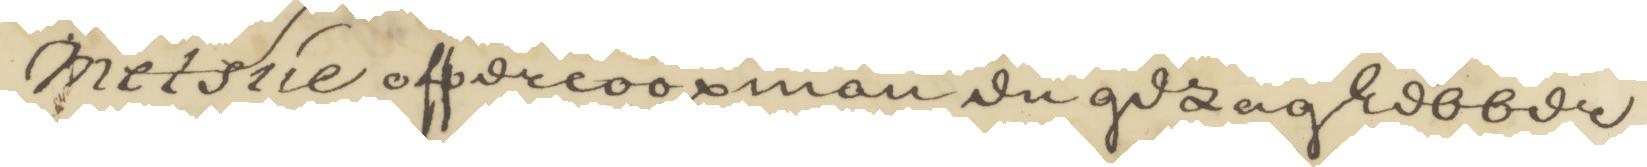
metsue oppercoopman en gezaghebber
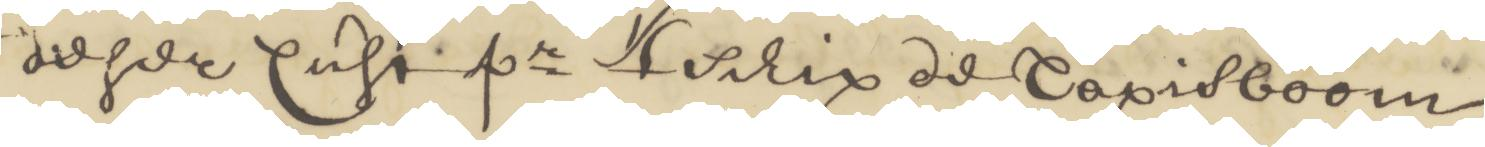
deser Cust p=r 't schip de Taxisboom
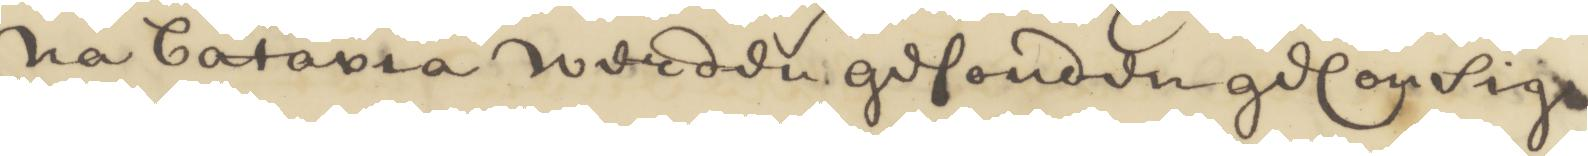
na batavia werden gesonden geconsigt
